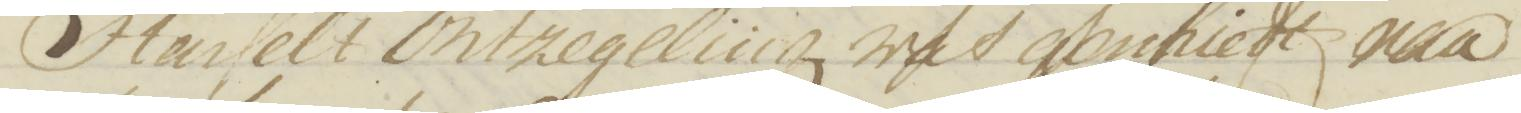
Hasselt ontzegeling was geschiedt van
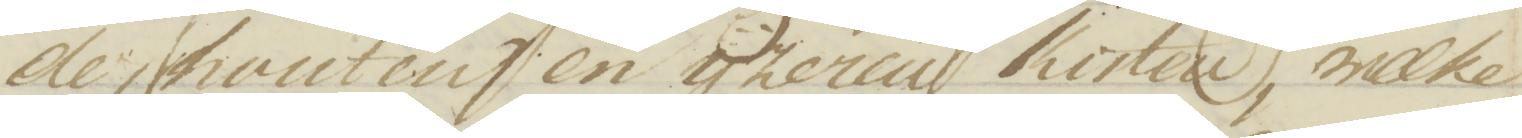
de houten en ijzeren Kisten, welke
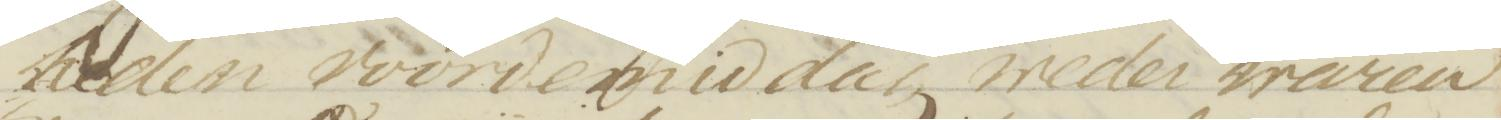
heden voordemiddag weder waren
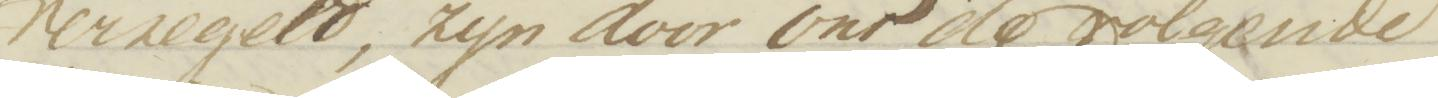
verzegeld, zijn door ons de volgende
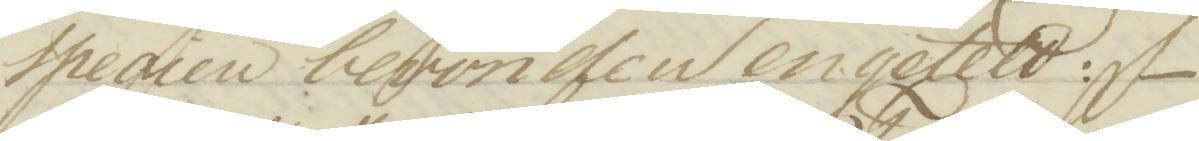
specien bevonden en geteld.
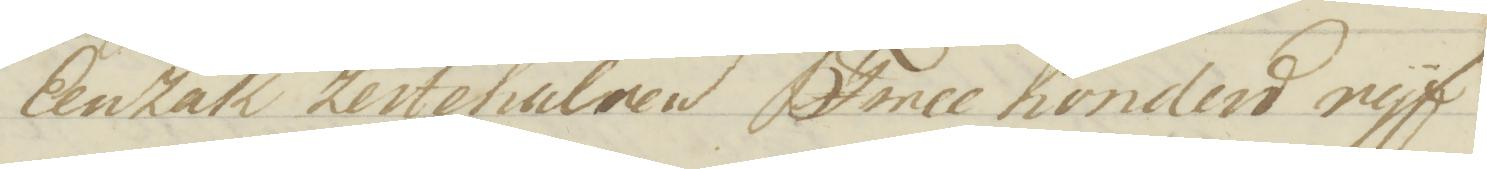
Een Zak zestehalven Twee honderd vijf
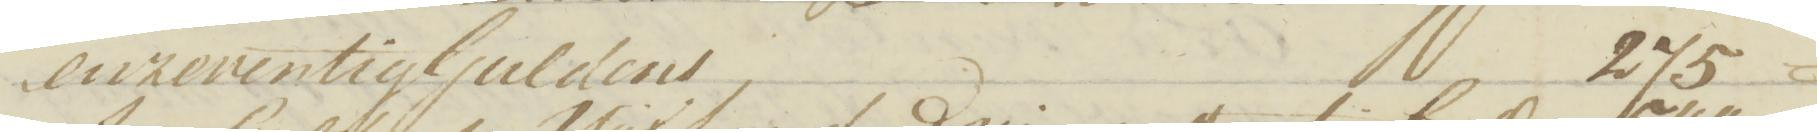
en zeventig Guldens 275 =
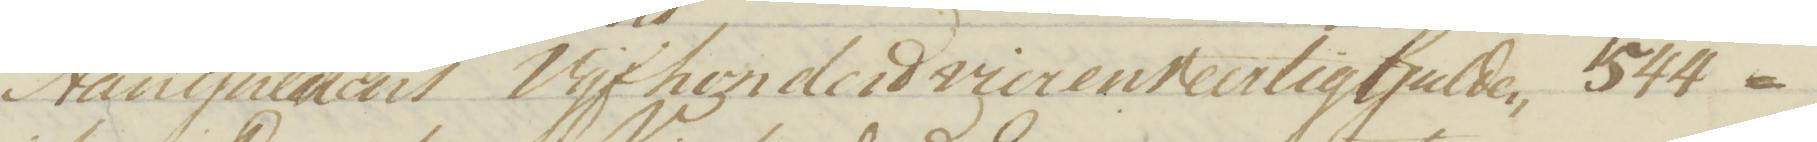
Aan Guldens Vijfhonderd vier en veertig Gulden 544 =
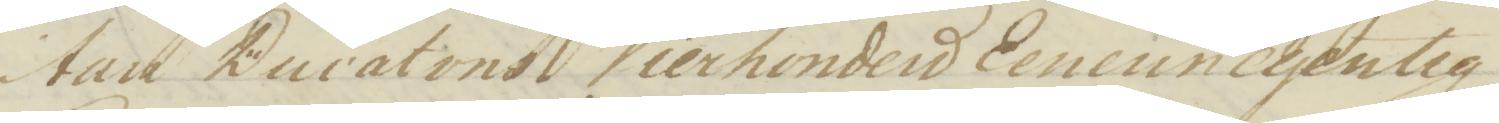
Aan Ducatons Vierhonderd Een en negentig
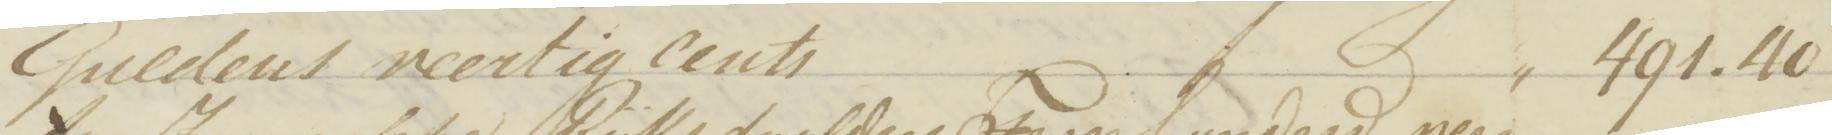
Guldens veertig cents „ 491.40
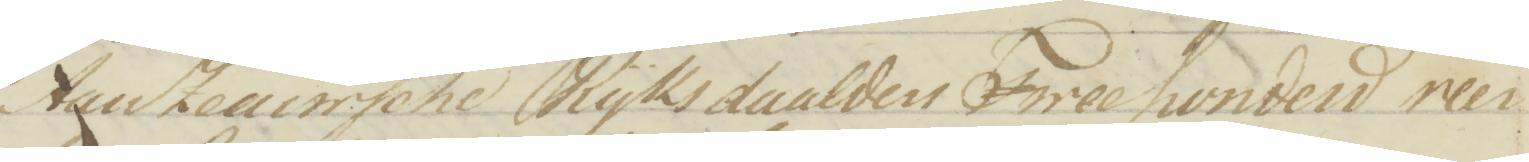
Aan Zeeuwsche Rijksdaalders Twee honderd veer
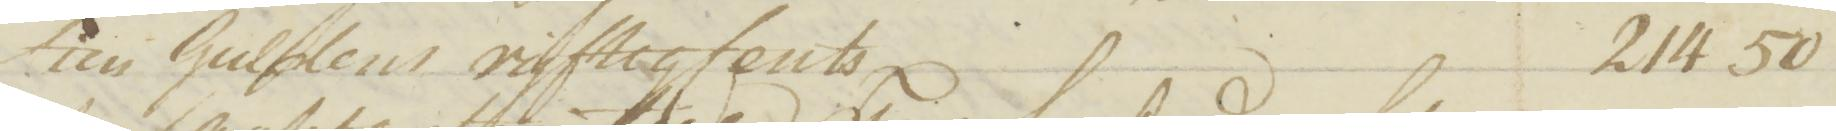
tien Guldens vijftig Cents 214 50
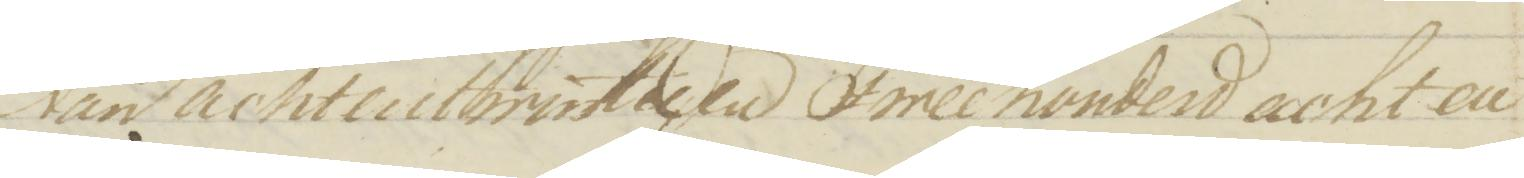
van achtentwintig en Twee honderd acht en
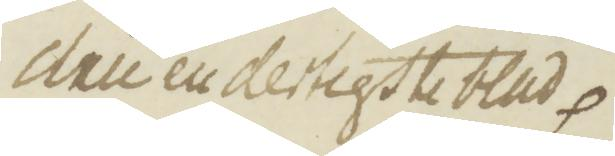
drie en dertigste blad
